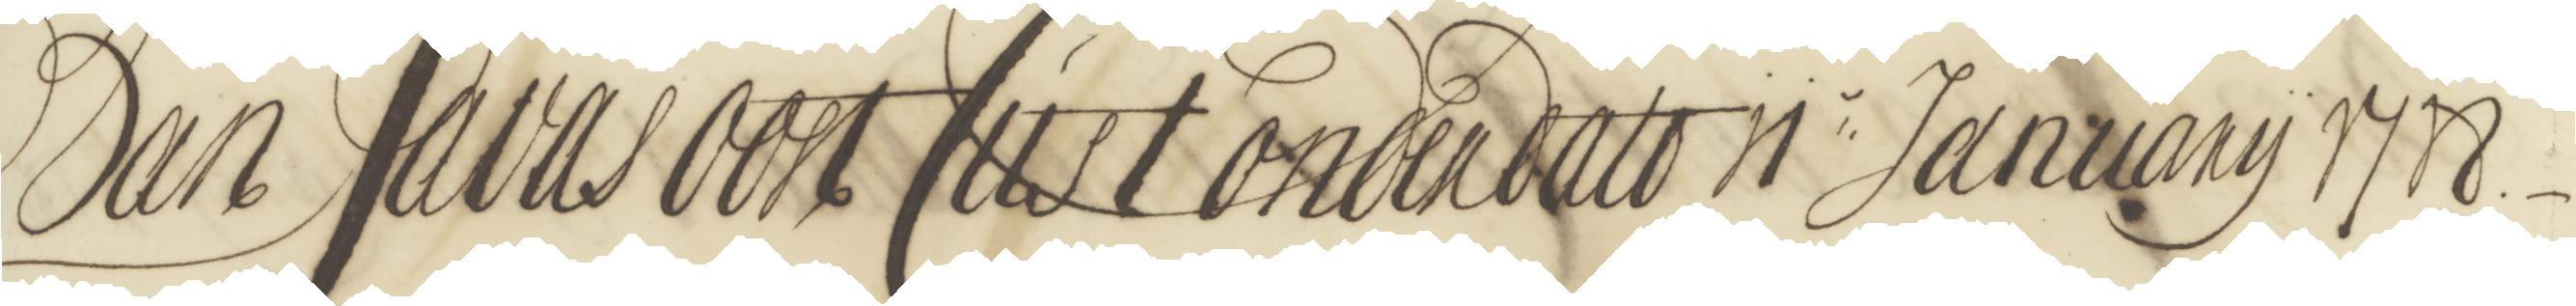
Van Java's oost Cust onder dato 11„' Januarij 1718. -
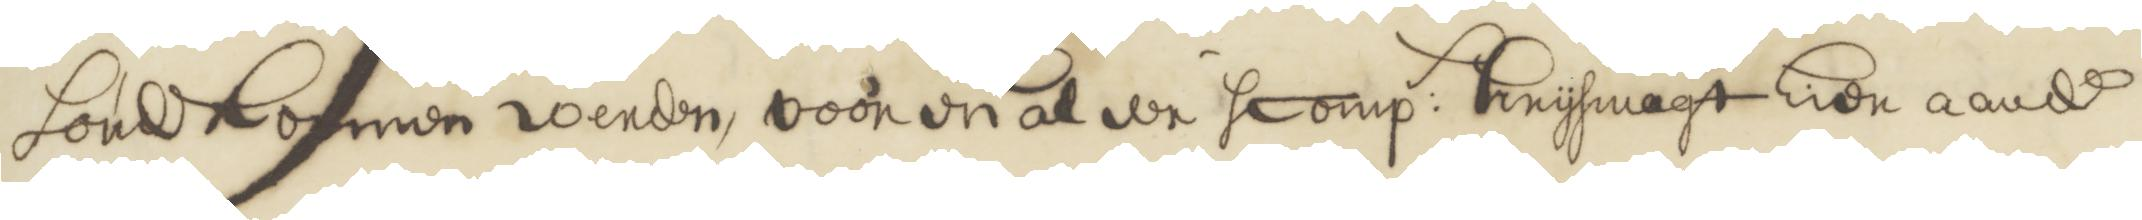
Soude konnen werden, voor en al eer 'S comp:s krijsmagt hier aande
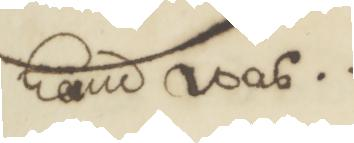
hand was.
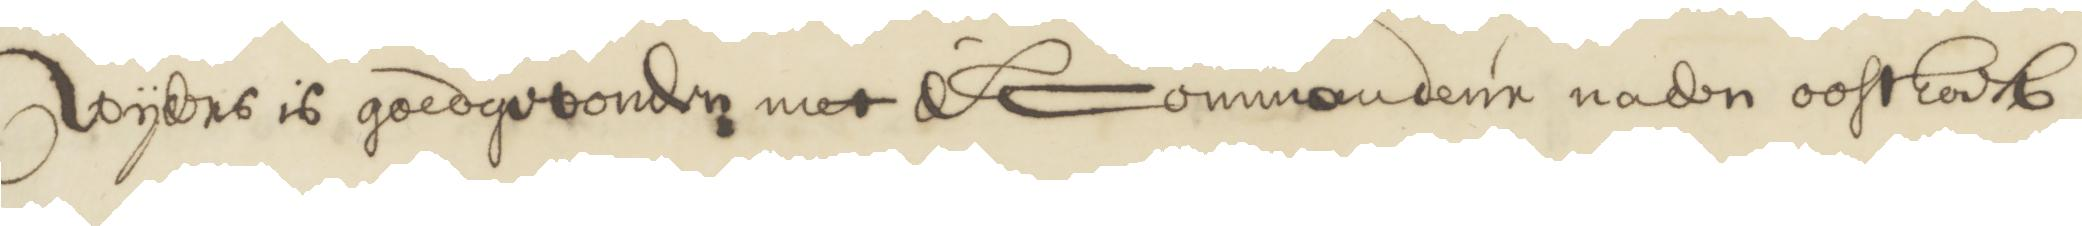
wijders is goedgevonden met d'E Commandeur naden oosthoek
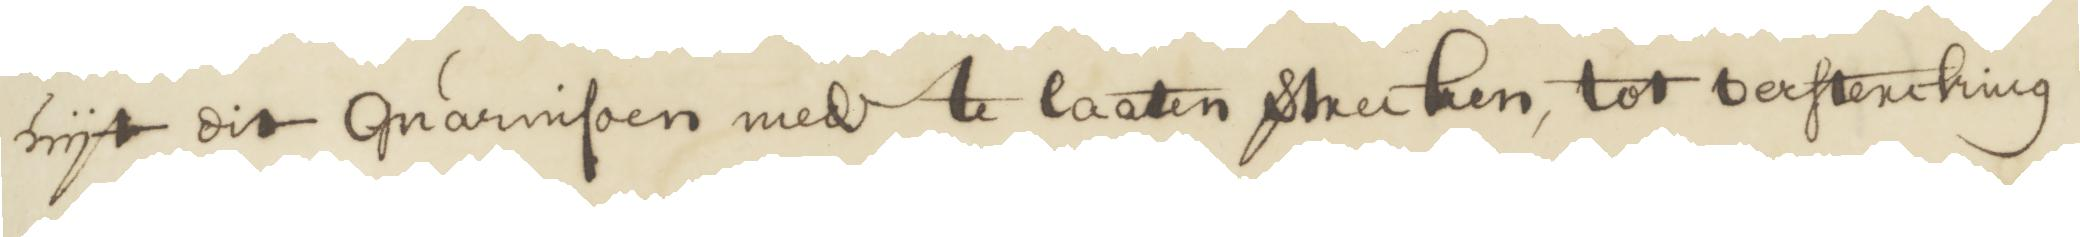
uijt dit guarnisoen mede te laaten vertrecken, tot verstercking
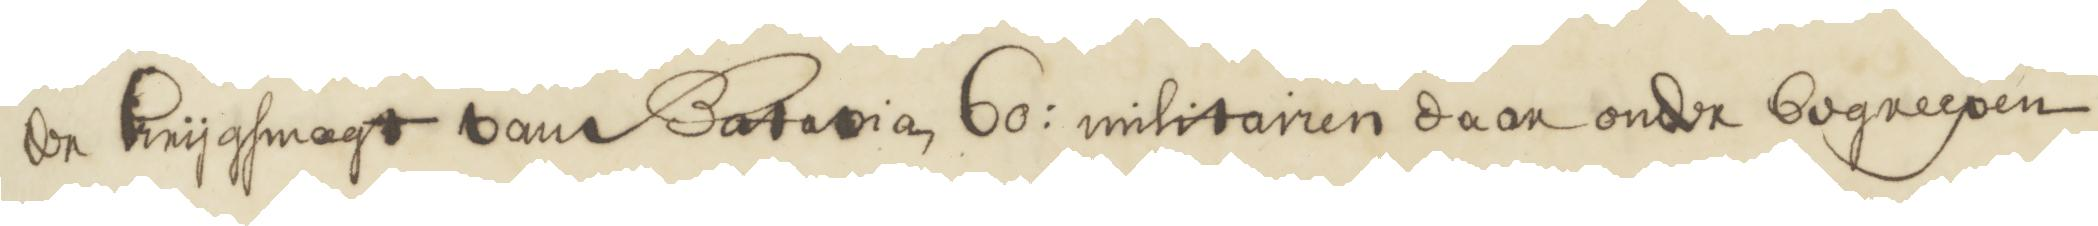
der krijgsmagt van Batavia 60: militairen daar onder begreepen
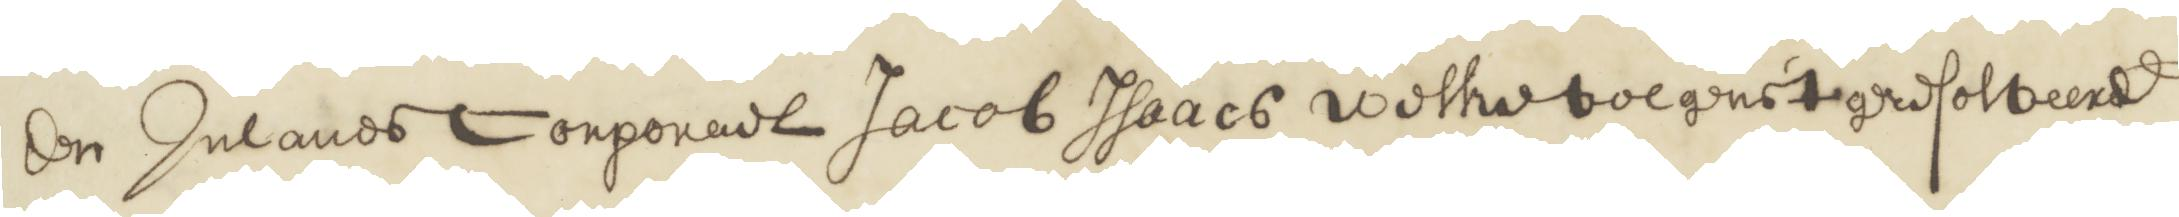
den Jnlands corporael Jacob Jsaacs welke volgens ’t geresolveerde
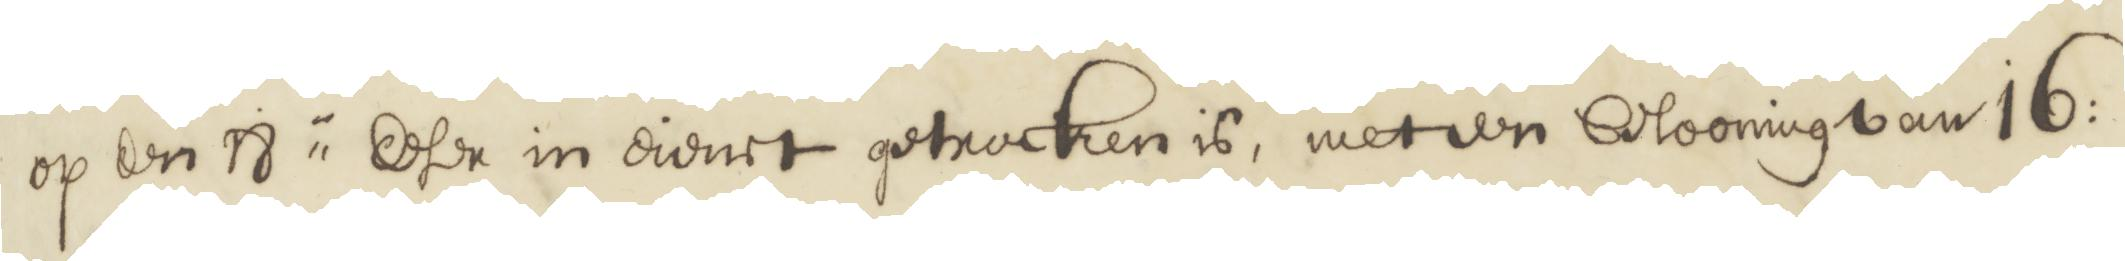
op den 18„' deser in dienst getrocken is, met een belooning van 16:
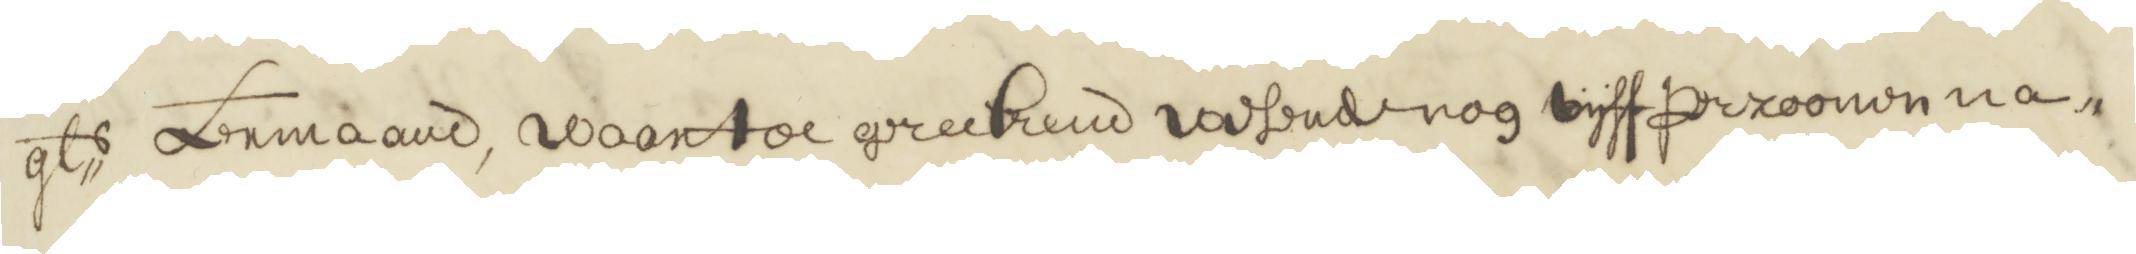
gl„s ter maand, waartoe gereekend wesende nog vijff perzoonen na„
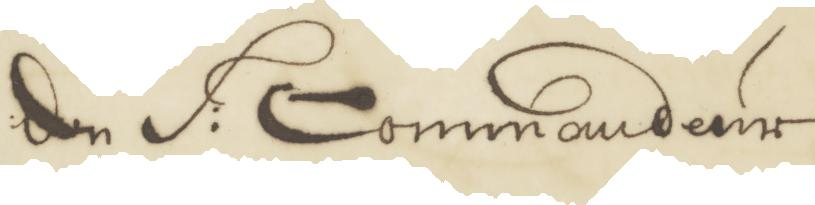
den E: Commandeur
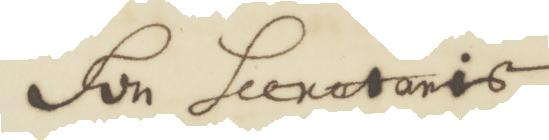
Een secretaris
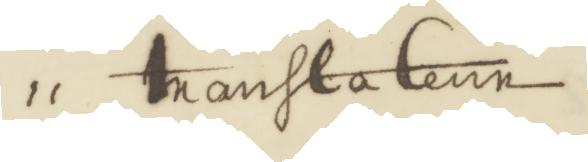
„ translateur
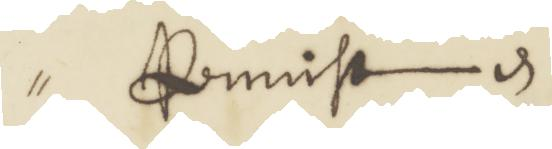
„ pennisten en
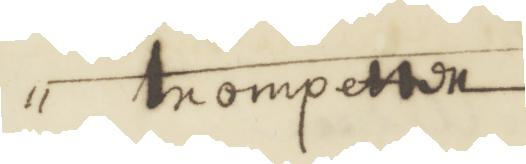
„ trompetter
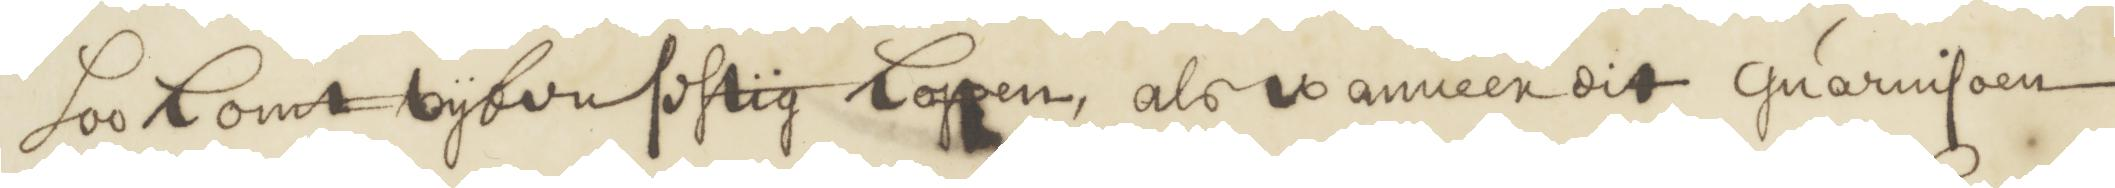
Soo komt vijf en sestig koppen, als wanneer dit guarnisoen
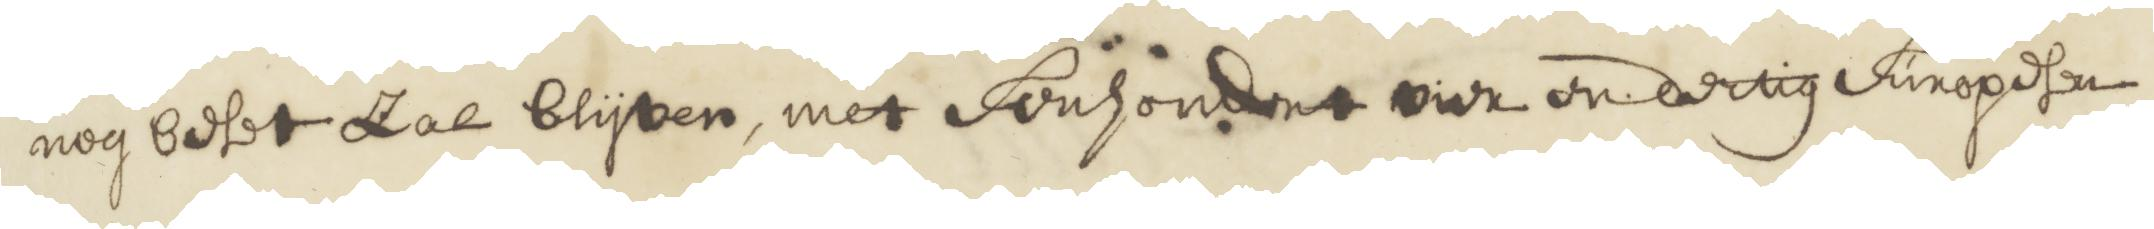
nog beset Zal blijven, met Een hondert vier en dertig Europesen
